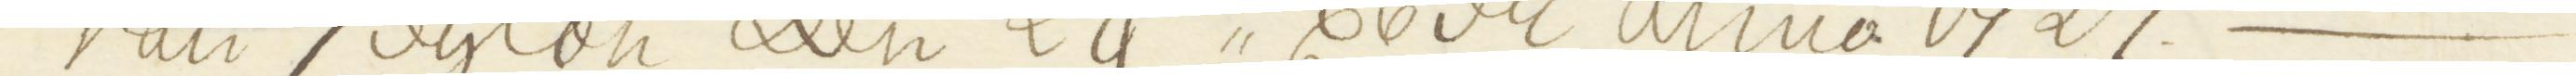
Van Ceijlon Den 24„en xber anno 1727.—
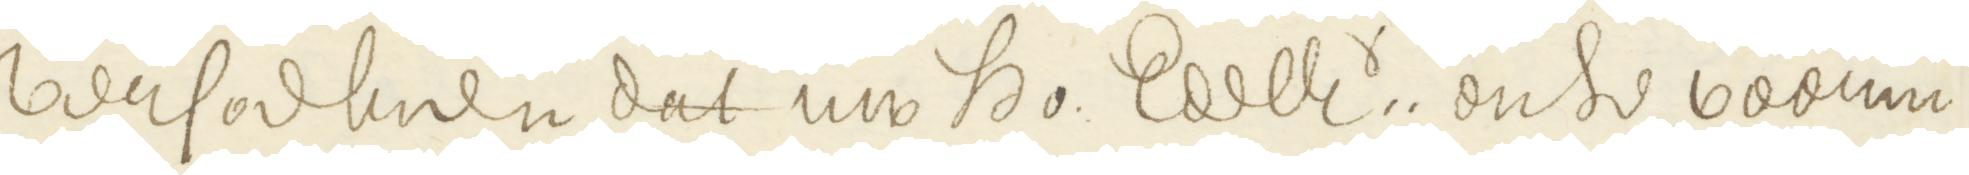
versoeken dat uw ho: Edelh„s onse voorm
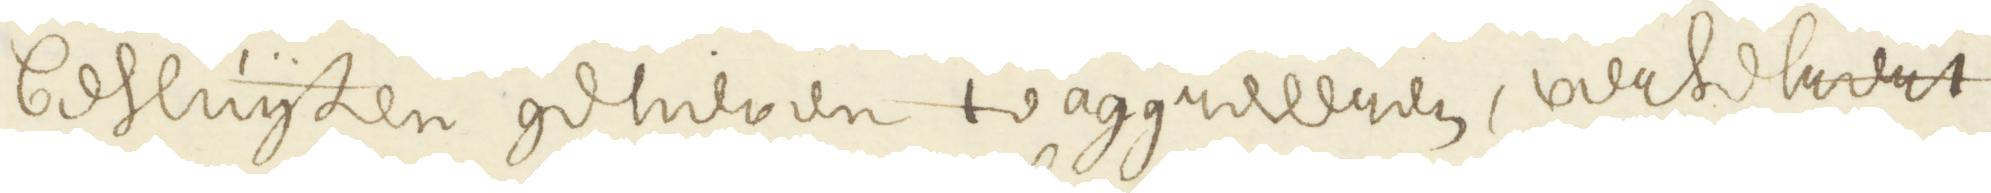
besluijten gelieven te aggreeeren, versekert
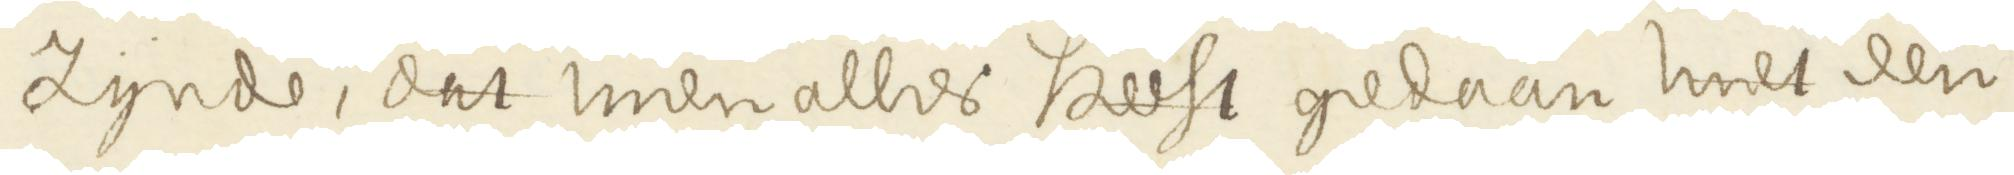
zijnde, dat men alles heeft gedaan met een
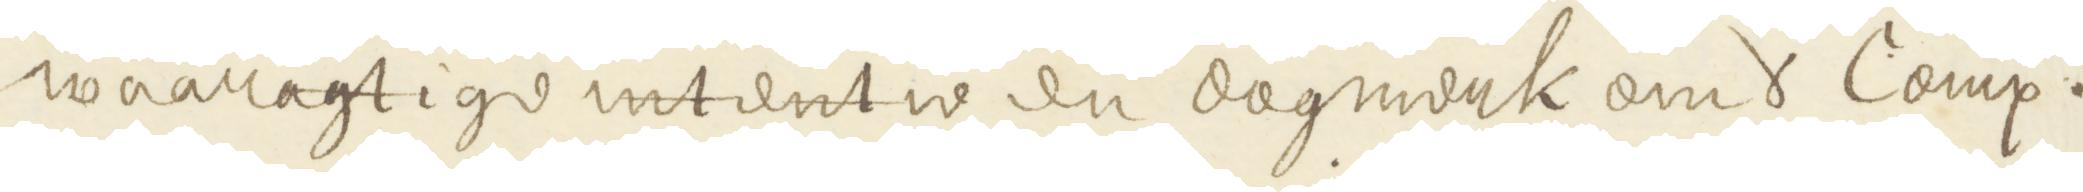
waaragtige intentie en dagmerk om 's Comp:s
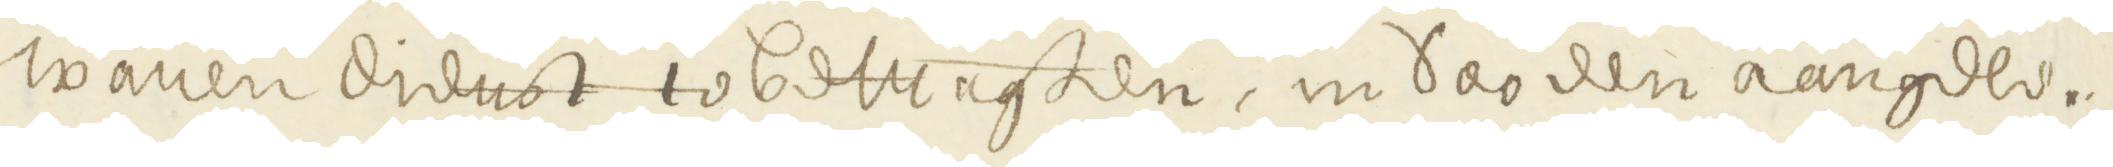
waren dienst te betragten, in soo een aangele„
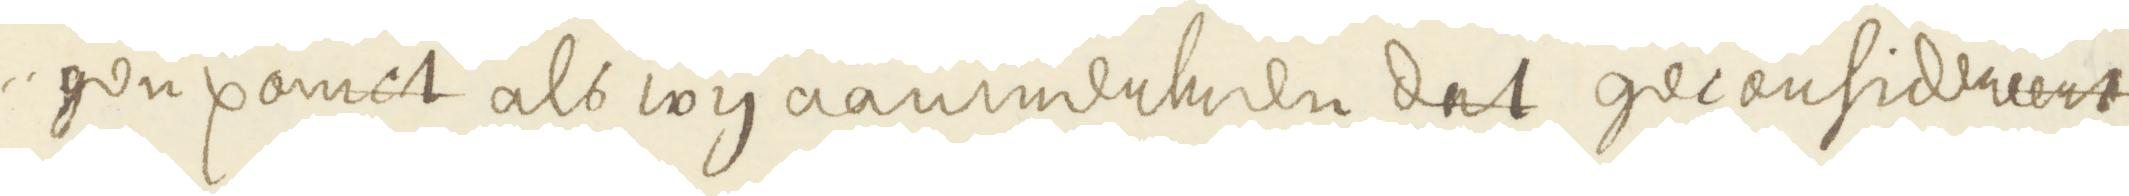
„gen poinct als wij aanmerken dat geconsidereert
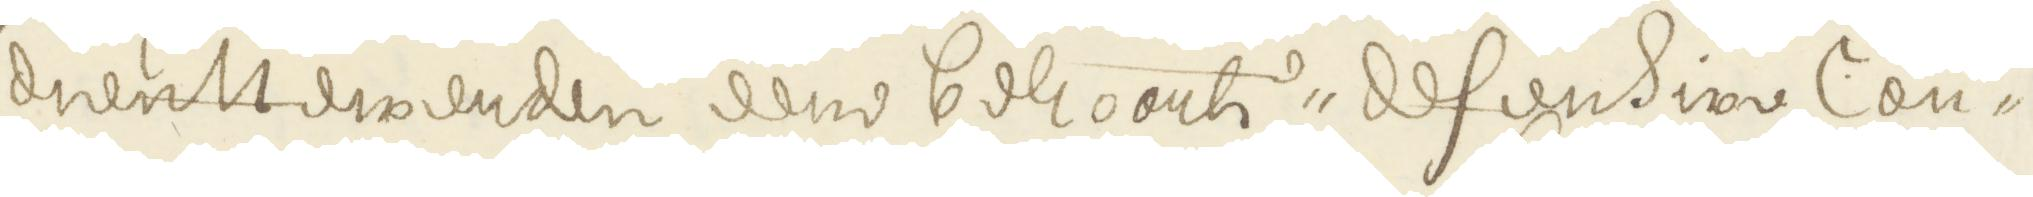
dienttewerden eene behoorh„e defensive Con„
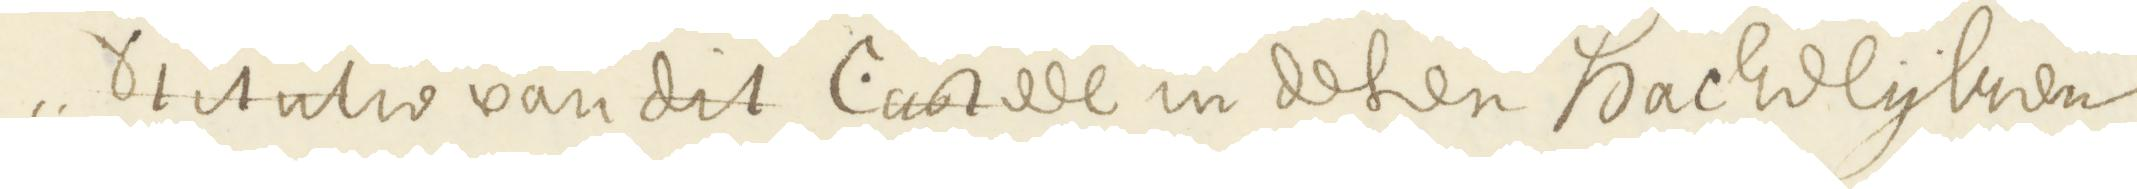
„stitutie van dit Casteel in desen hachelijken
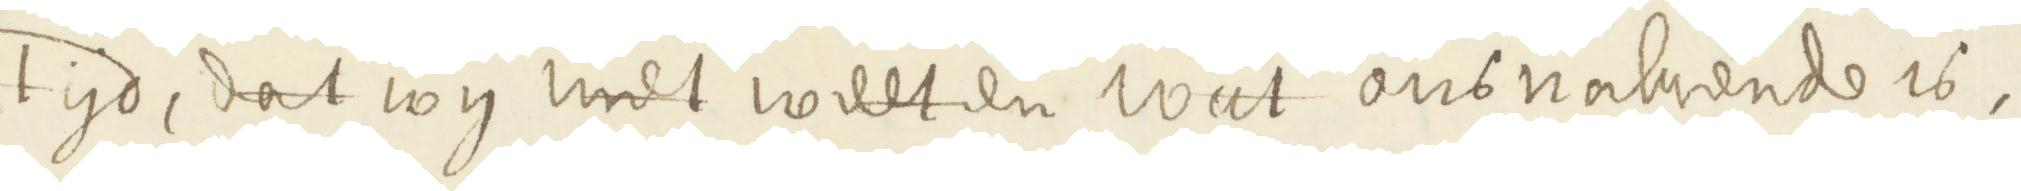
tijd, dat wij niet weeten wat ons nakende is,
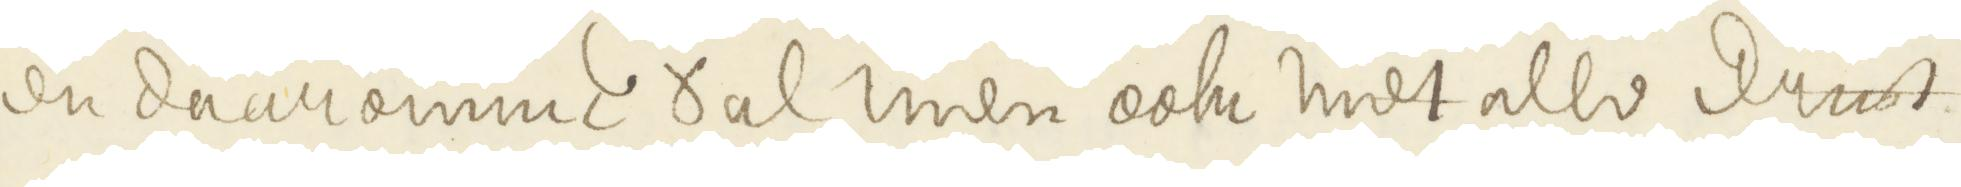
en daaromme sal men ook met alle Ernst
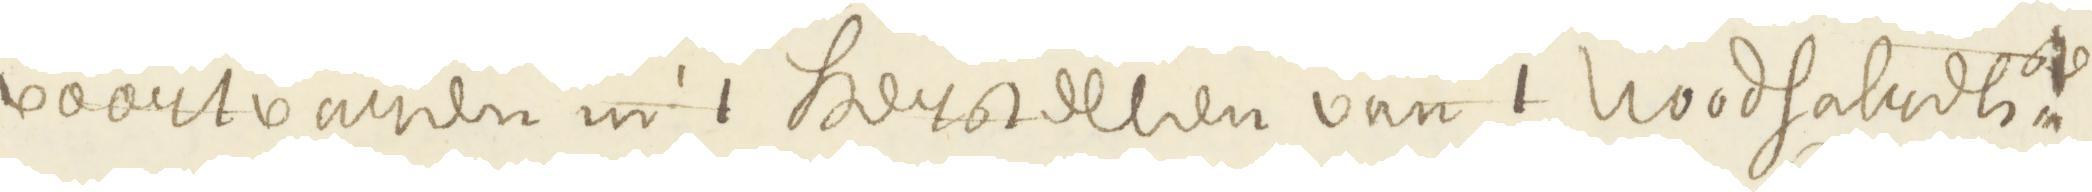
voortvaren in ’t herstellen van ’t noodsakel„ste
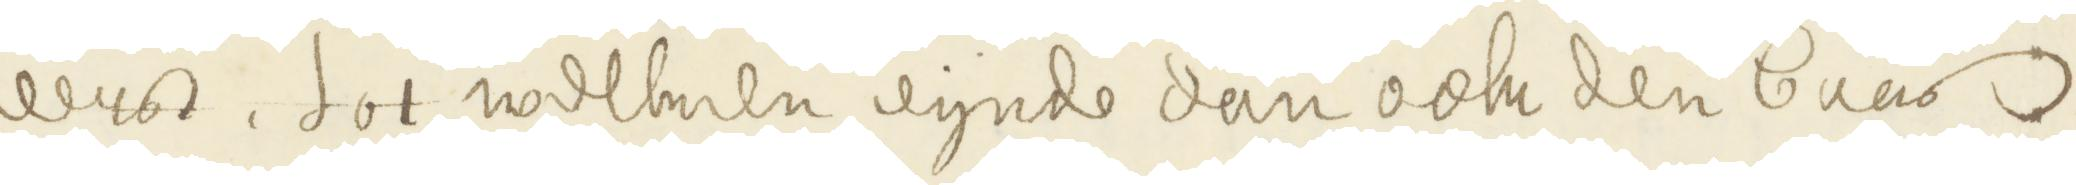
eerst, tot welken eijnde dan ook den baas
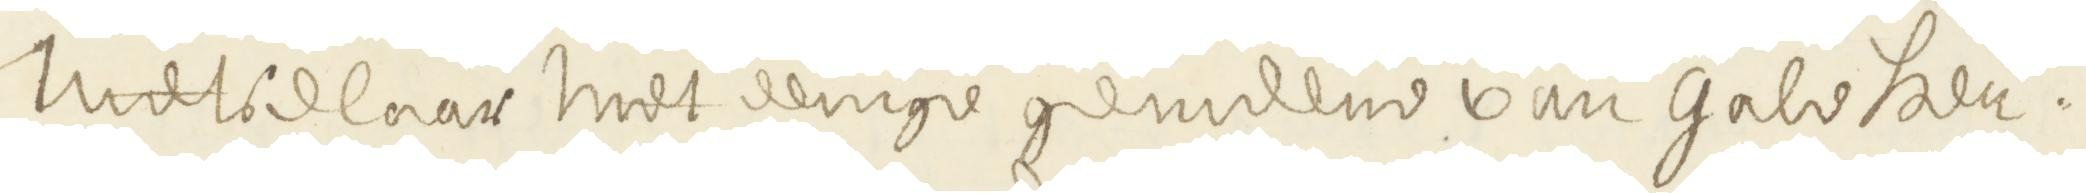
metselaar met eenige gemeene van gale her„
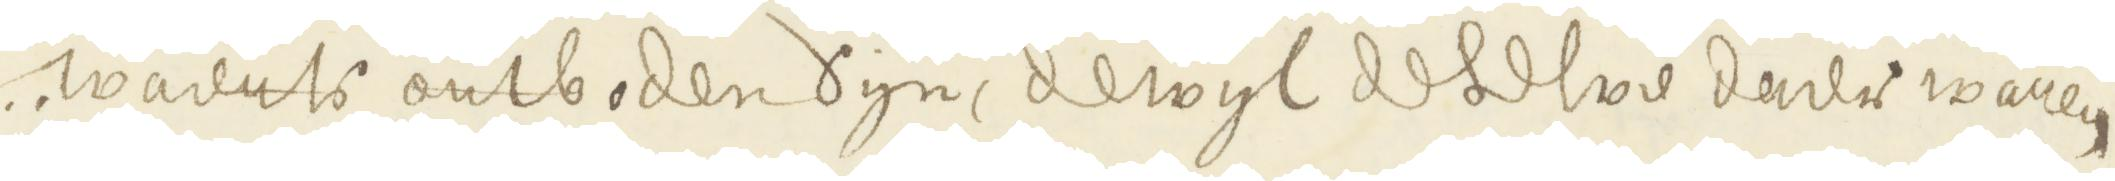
„waerts ontboden sijn, dewijl deselve daer waren
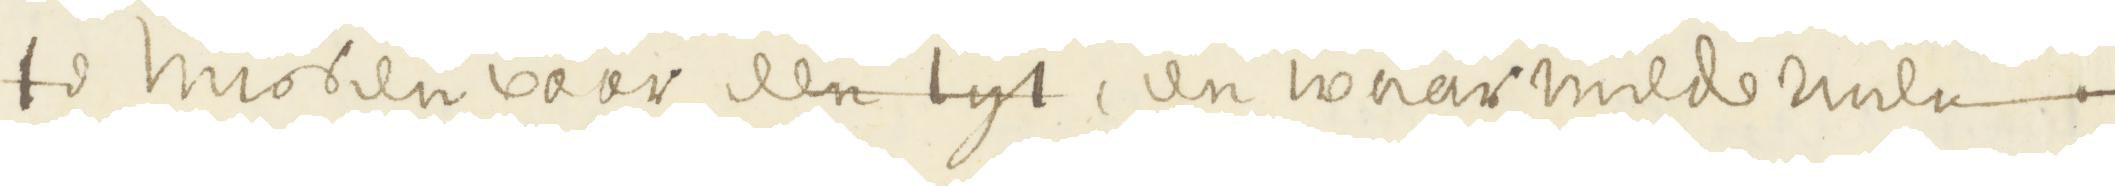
te missen voor een tijt, en waar mede men
